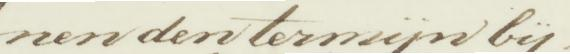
nen den termijn bij
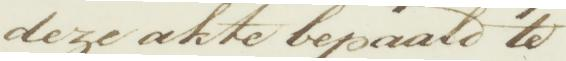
deze akte bepaald te
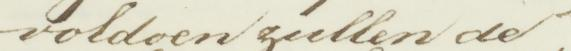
voldoen zullen de
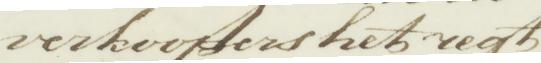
verkoopers het regt
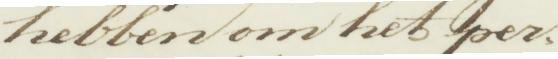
hebben om het per„
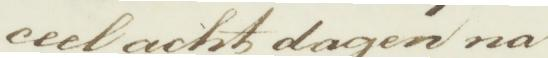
ceel acht dagen na
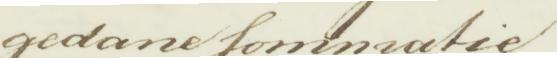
gedane sommatie
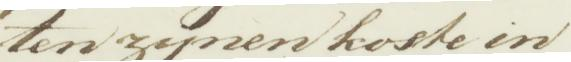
ten zynen koste in
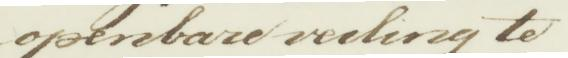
openbare veiling te
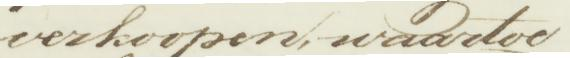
verkoopen, waartoe
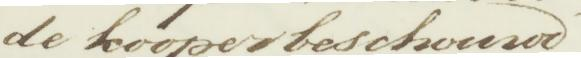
de kooper beschouwd
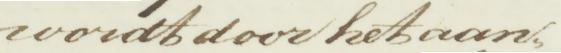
wordt door het aan„
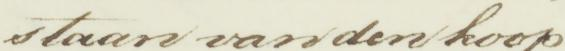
staan van den koop
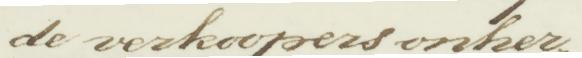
de verkoopers onher„
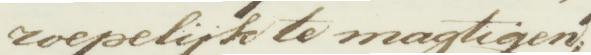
roepelijk te magtigen:
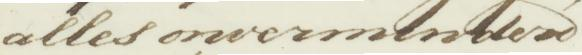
alles onverminderd
